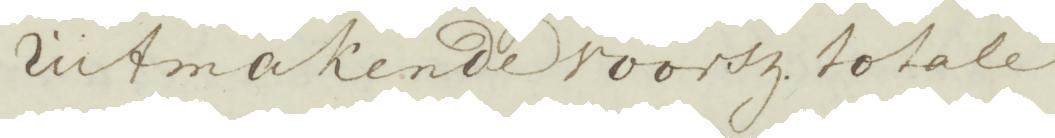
uitmakende voorsz. totale
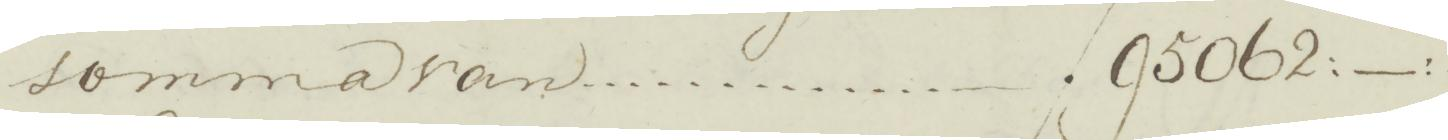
somma van . . . . . . . . . . . . . — ƒ95062:—:
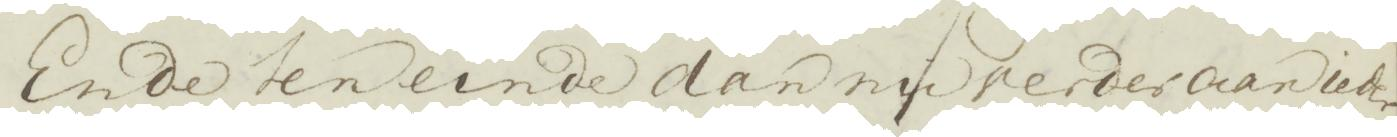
Ende ten einde dan nu verder aan ieder
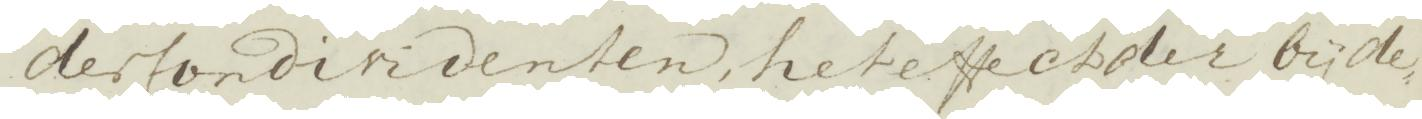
der Condividenten, het effect der bij de„
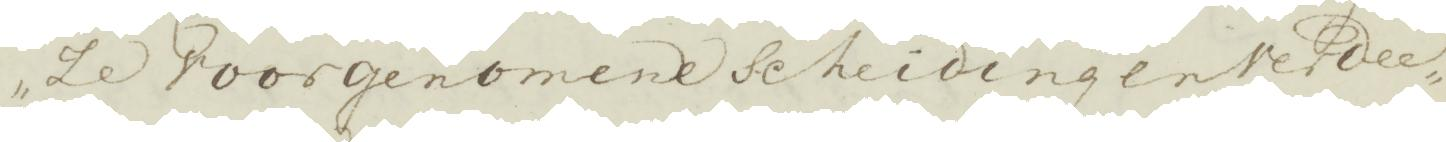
„ze voorgenomene scheiding en verdee„
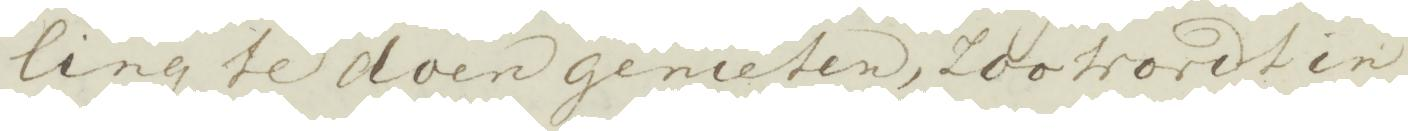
ling te doen genieten, zoo wordt in
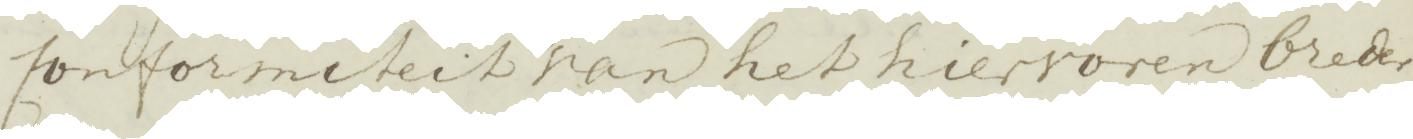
Conformiteit van het hiervoren brede
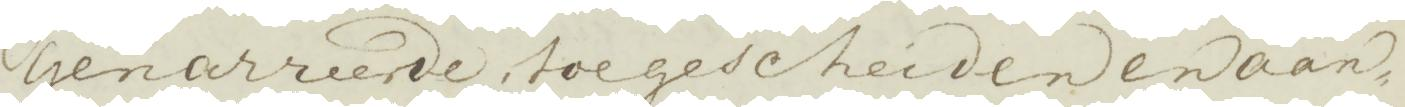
genarreerde, toegescheiden en aan„
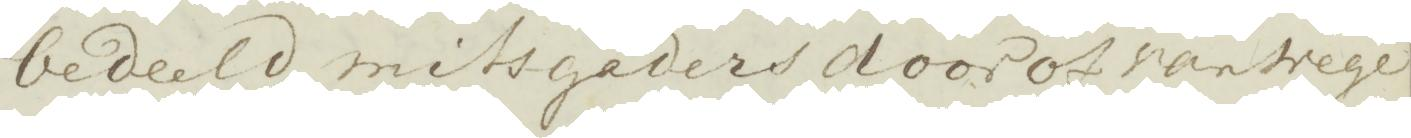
bedeeld, mitsgaders door of van wege
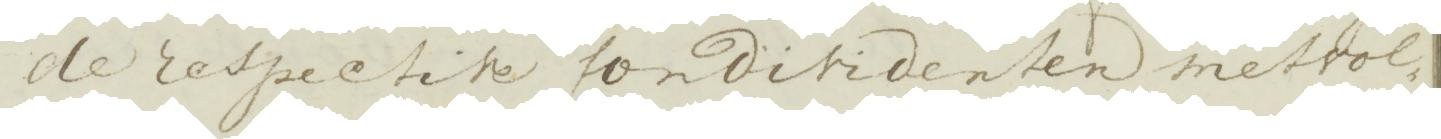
de respective Condividenten met vol„
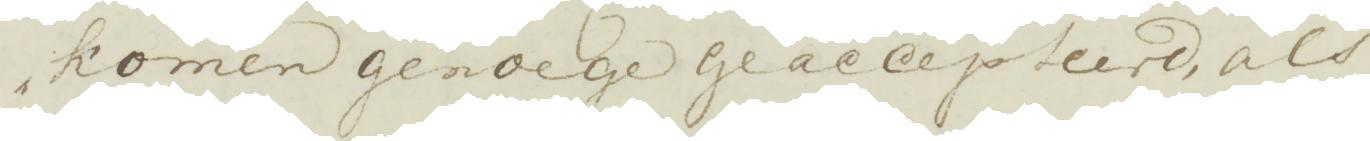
„komen genoege geaccepteerd, als
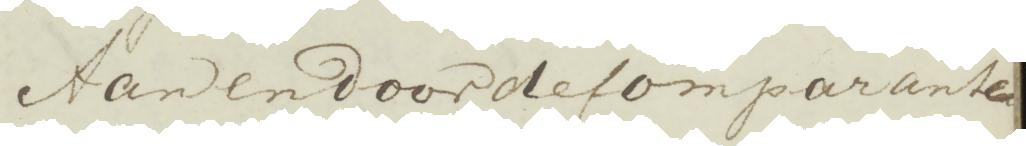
Aan en door de comparante
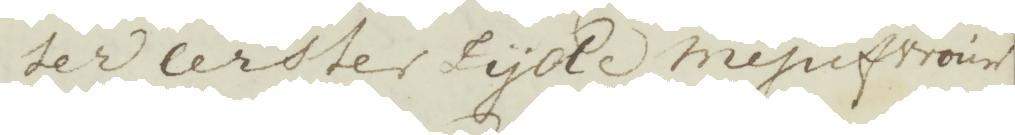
ter eerster zijde mejufvrouw
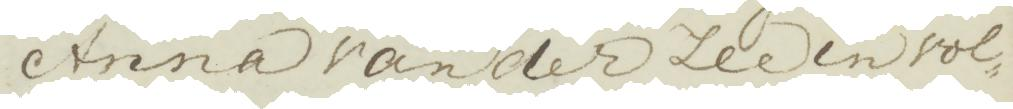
Anna van der zee en vol„
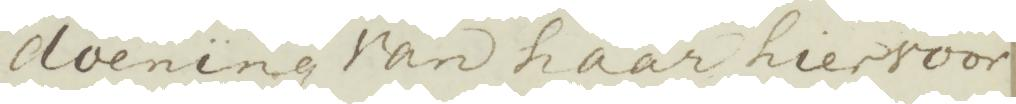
doening van haar hier voor
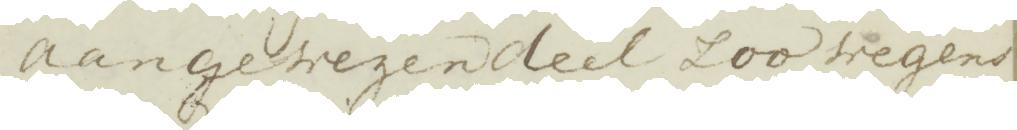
aangewezen deel zoo wegens
